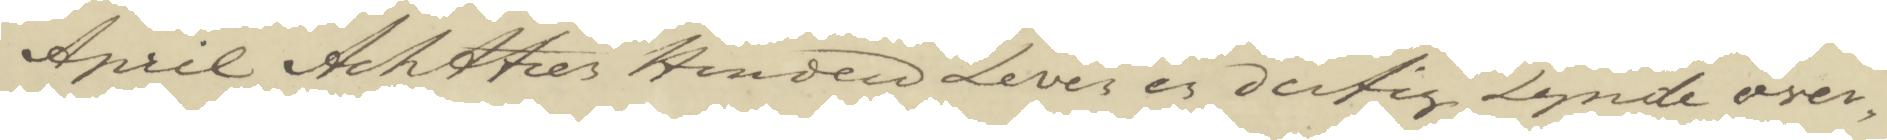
April Achttien Honderd Zeven en dertig zynde over„
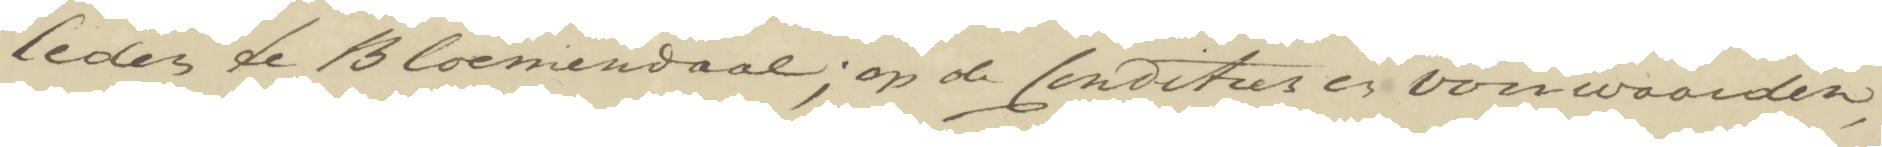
leden te Bloemendaal; op de Conditien en voorwaarden,
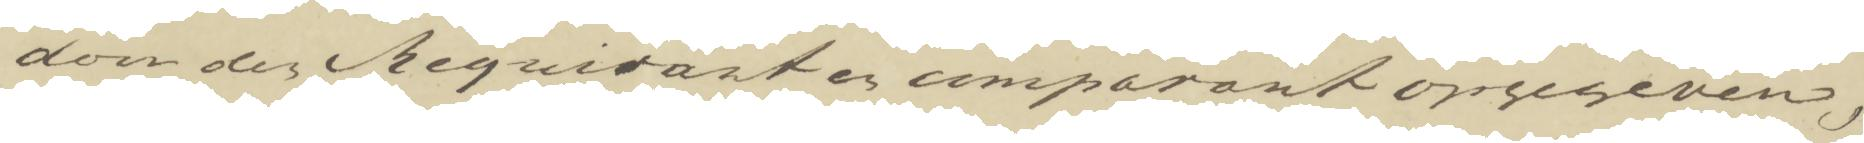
door den Requirant en comparant opgegeven
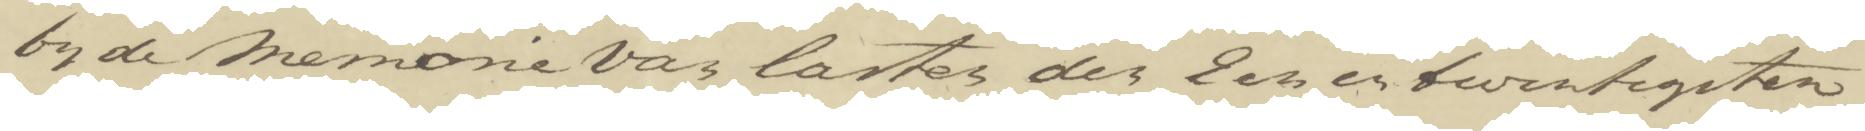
by de memorie van lasten den Een en twintigsten
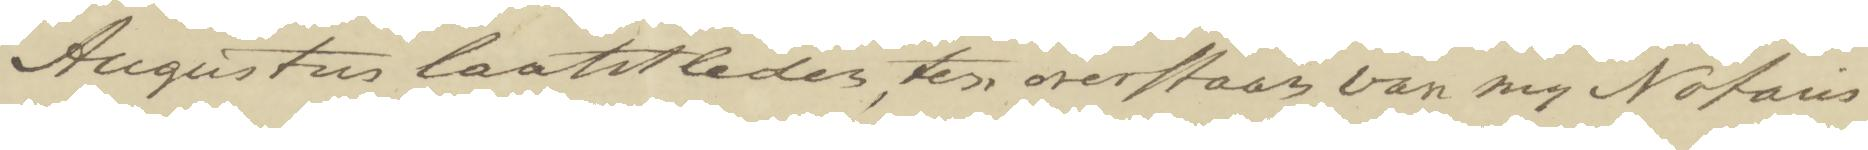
Augustus laatstleden, ten overstaan van my Notaris
